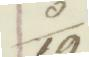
5/19
